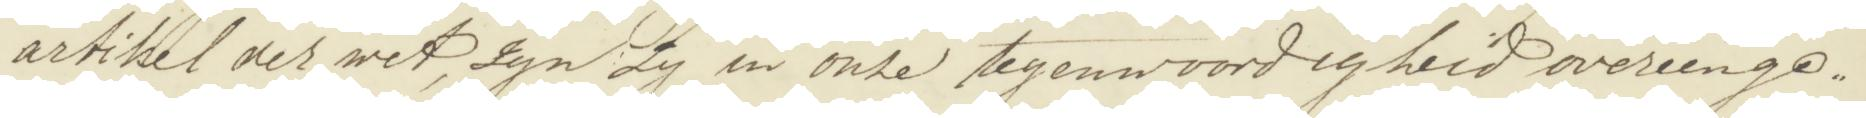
artikel der wet, zyn zy in onze tegenwoordigheid overeenge„
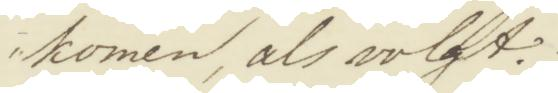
„komen, als volgt.
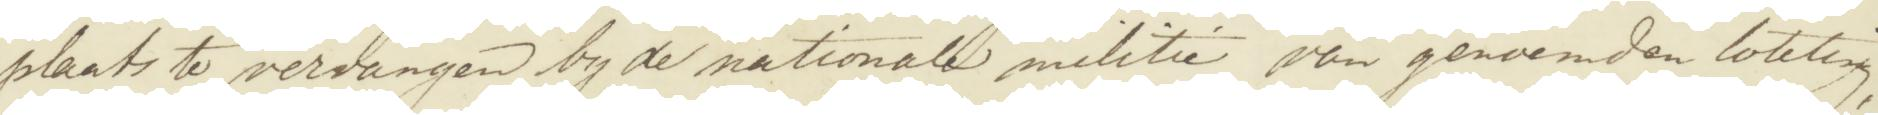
plaats te vervangen by de nationale militie van genoemden loteling,
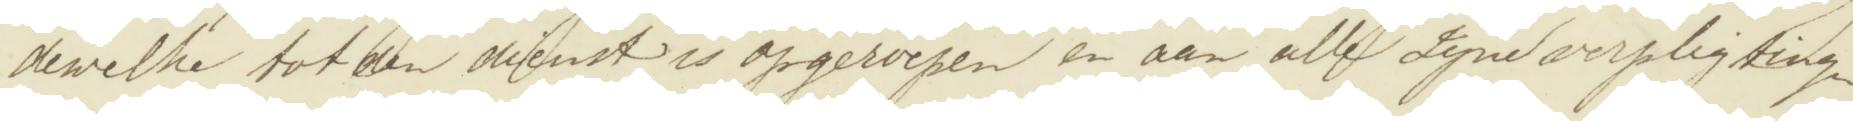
dewelke tot den dienst is opgeroepen en aan alle zyne verpligtingen
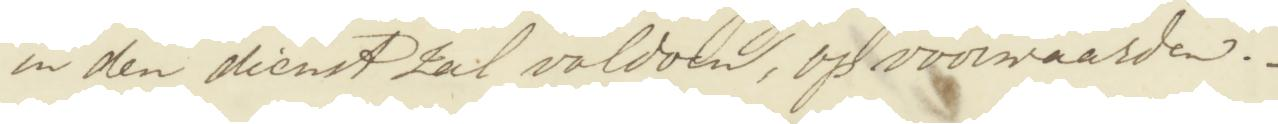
in den dienst zal voldoen, op voorwaarden.
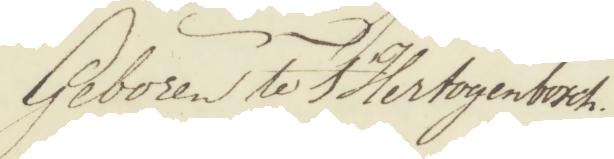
Geboren te s'Hertogenbosch.
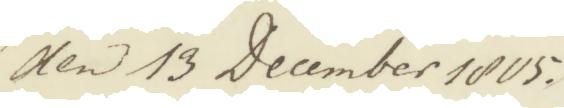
den 13 December 1805.
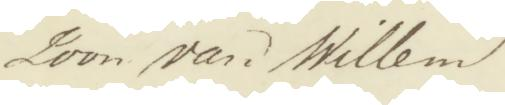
Zoon van Willem
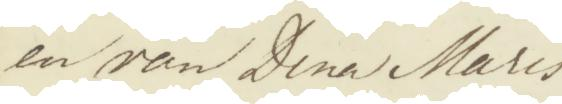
en van Dina Maris
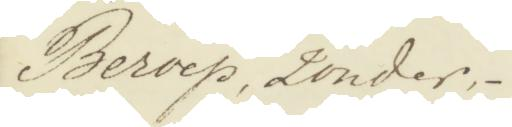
Beroep, zonder, -
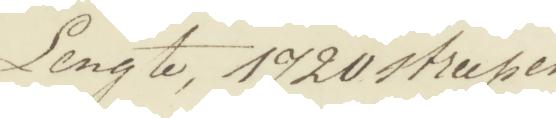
Lengte, 1720 streepen
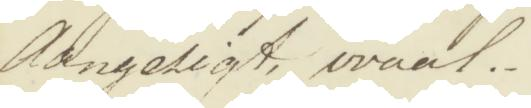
Aangezigt, ovaal. -
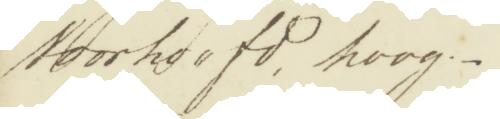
Voorhoofd, hoog. -
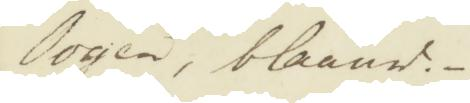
Oogen, blaauw. -
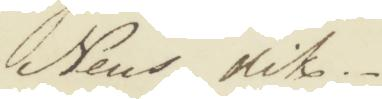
Neus, dik. -
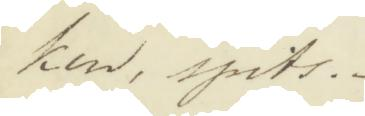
kin, spits.
